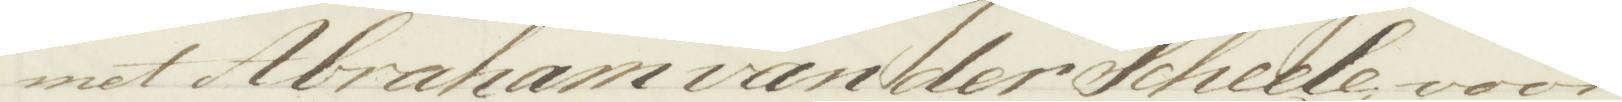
met Abraham van der Scheele voor
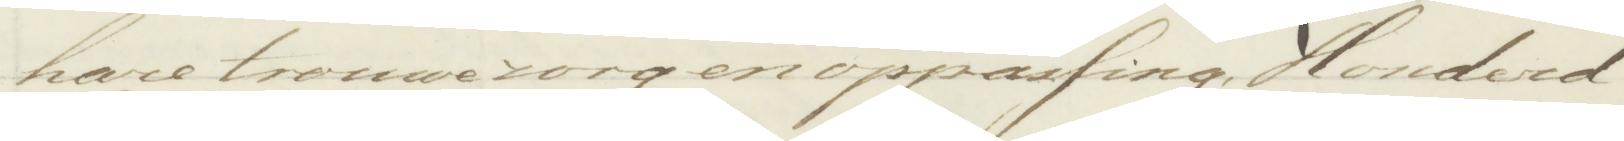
hare trouwe zorg en oppassing Honderd
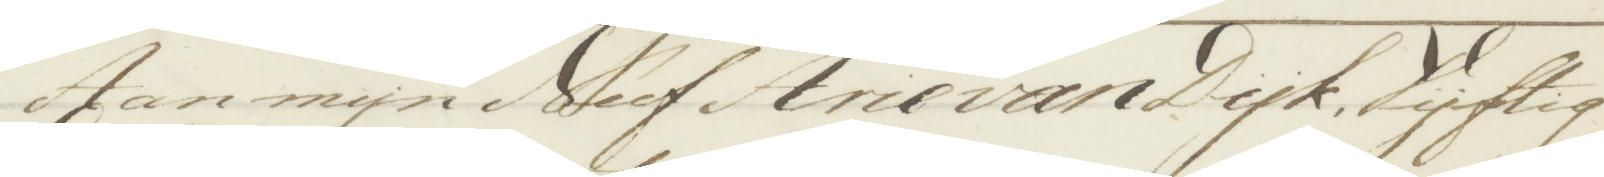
Aan mijn Neef Arie van Dijk, Vijftig
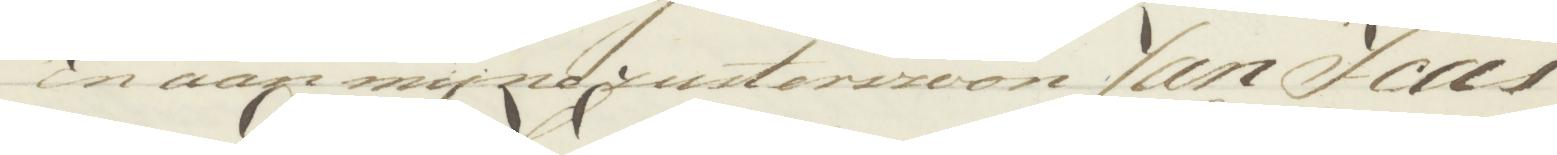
en aan mijne zusterszoon Jan Icas
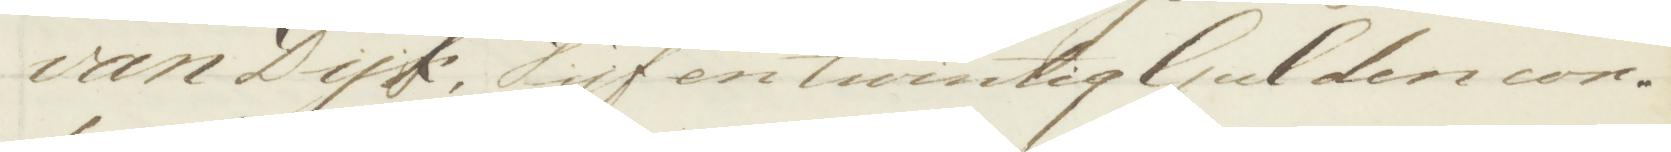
van Dijk, vijf en twintig Gulden con„
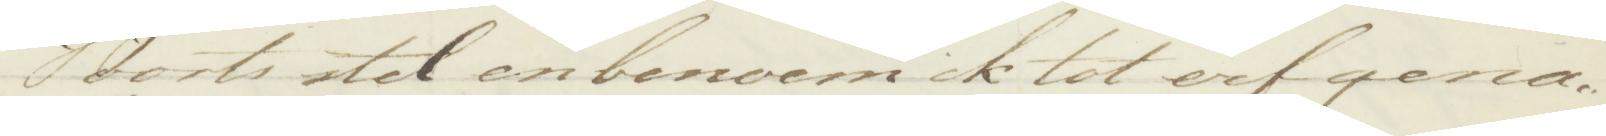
Voorts stel en benoem ik tot erf gena„
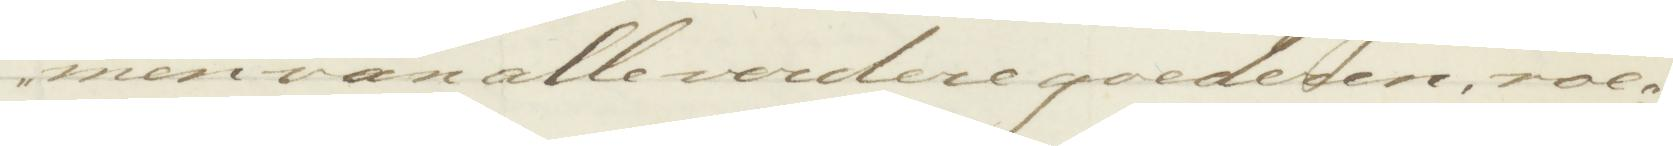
„men van alle verdere goederen, roe
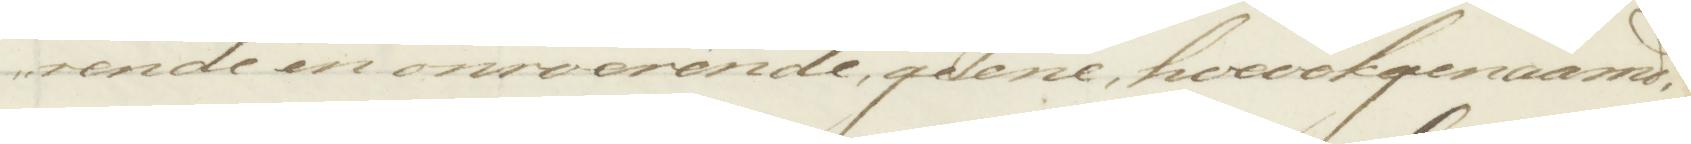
„rende en onroerende, geene, hoe ook genaamd,
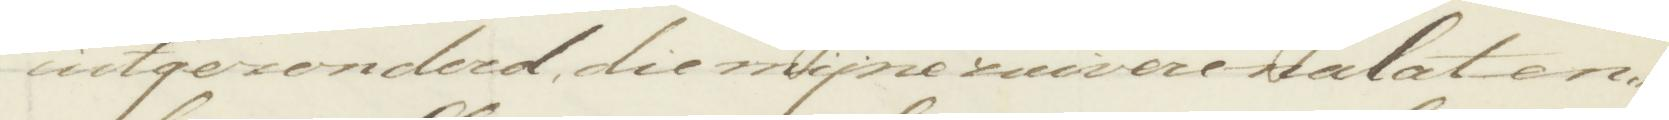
uitgezonderd, die mijne zuivere nalaten„
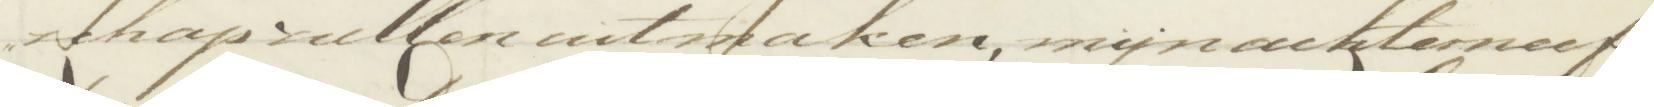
„schap zullen uitmaken, mijn achterneef
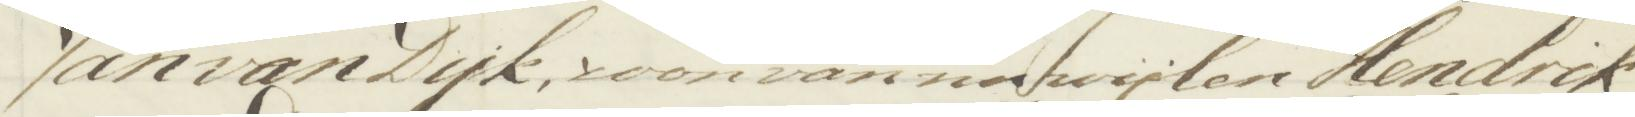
Jan van Dijk, zoon van nu wijlen Hendrik
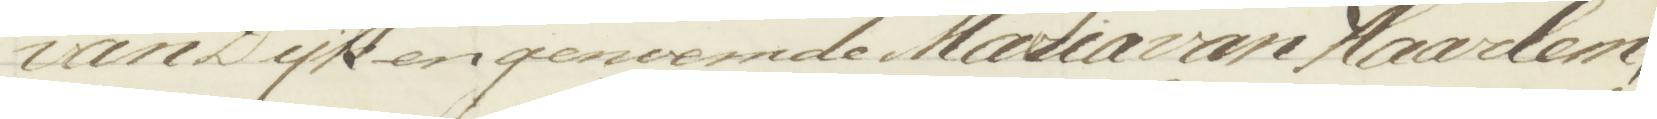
van Dijk en genoemde Maria van Haarlem,
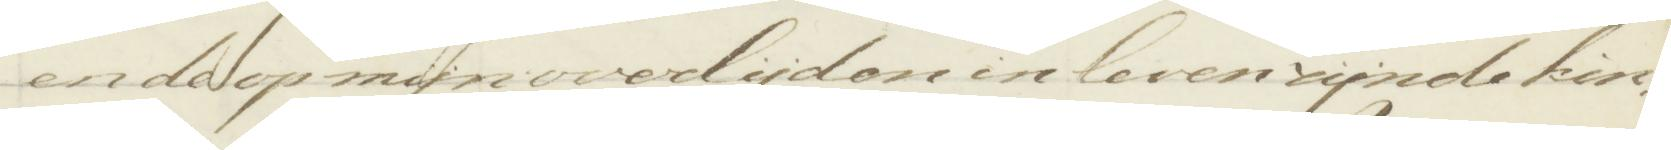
en de op mijn overlijden in leven zijnde kin„
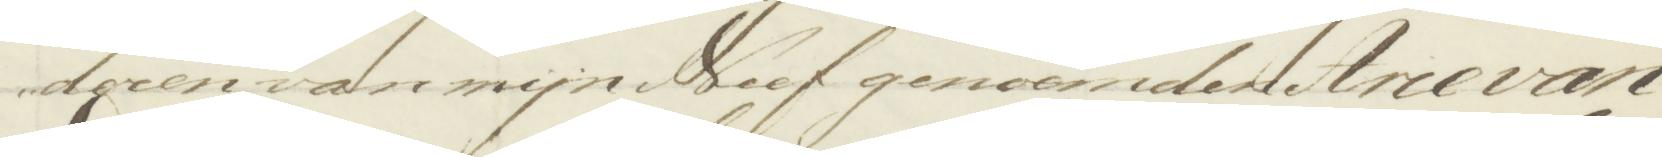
„deren van mijn Neef genoemde Arie van
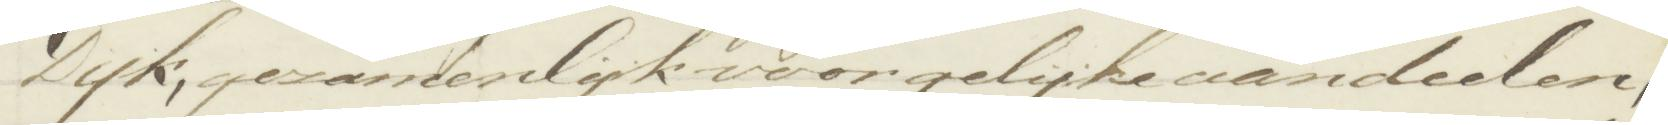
Dijk, gezamenlijk voor gelijke aandeelen,
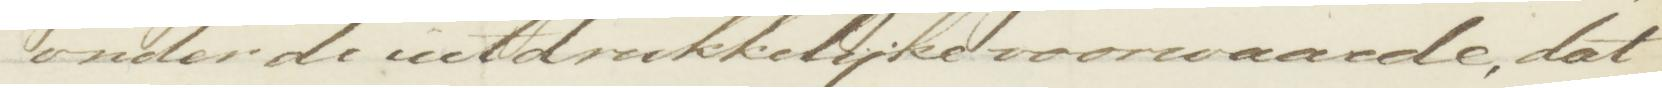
onder de uitdrukkelijke voorwaarde, dat
